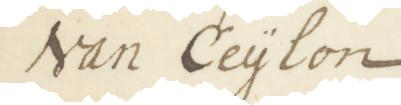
van Ceijlon
